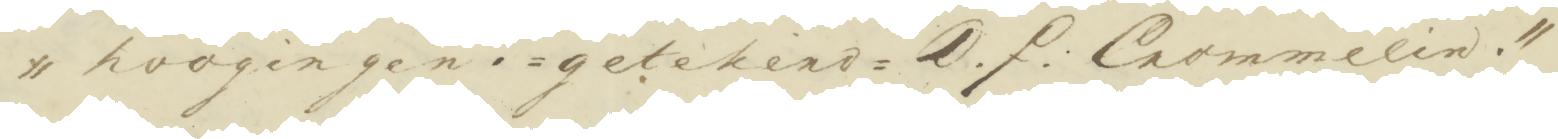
„hoogingen. =getekend = D. f. Crommelin."
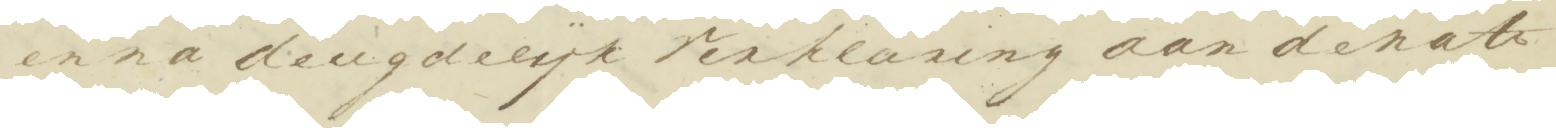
en na deugdelijk verklaring aan de na te
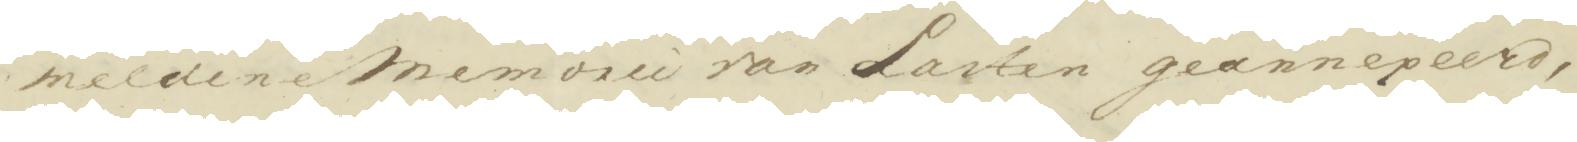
meldene Memorie van Lasten geannexeerd,
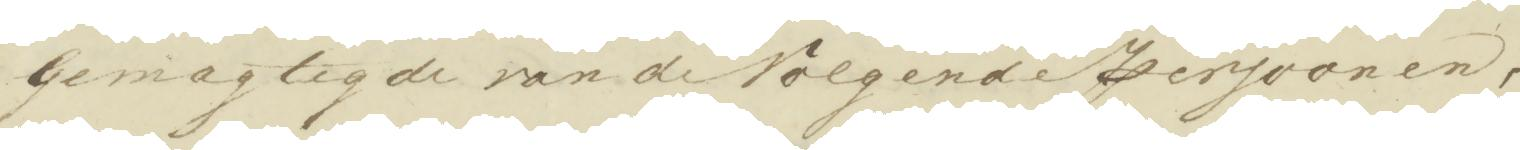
Gemagtigde van de Volgende Persoonen,
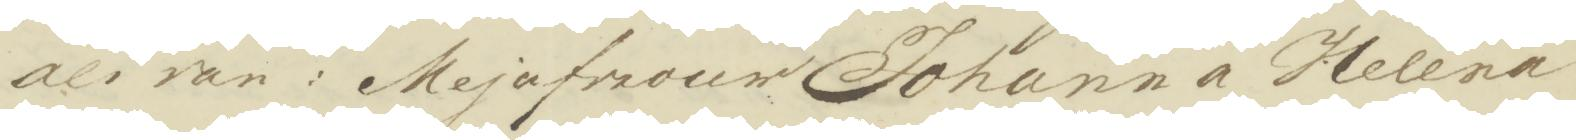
als van : Mejufvrouw Johanna Helena
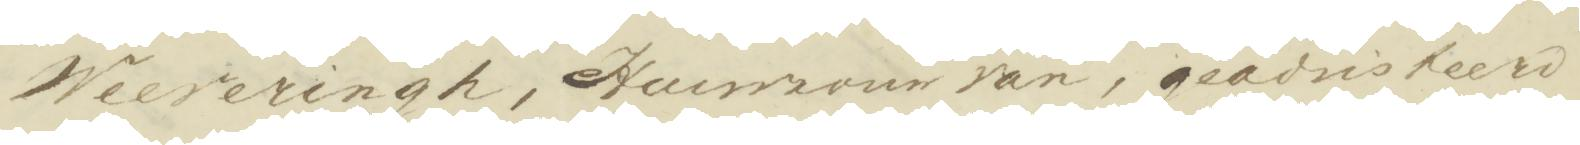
Weeveringh, Huisvrouw van , geadsisteerd
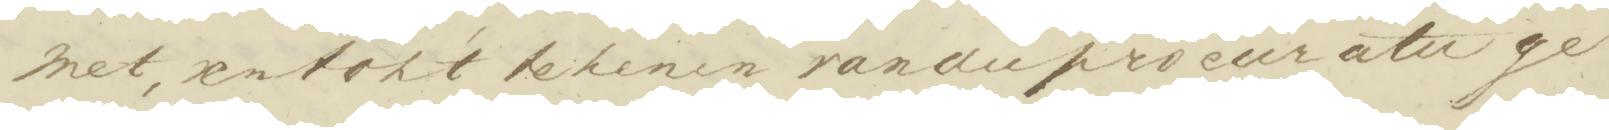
met, en tot 't tekenen van die procuratie ge
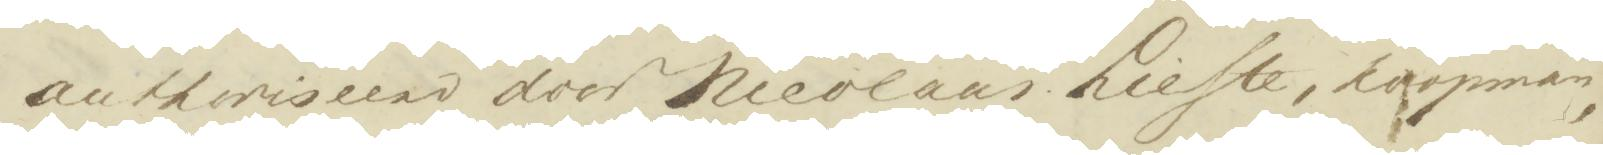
authoriseerd door Nicolaas Lieste, koopman,
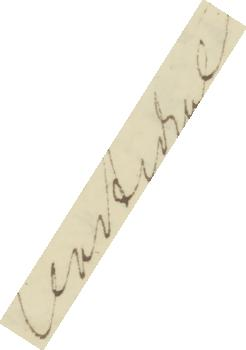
Eertichal
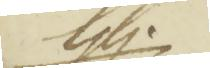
GG,
